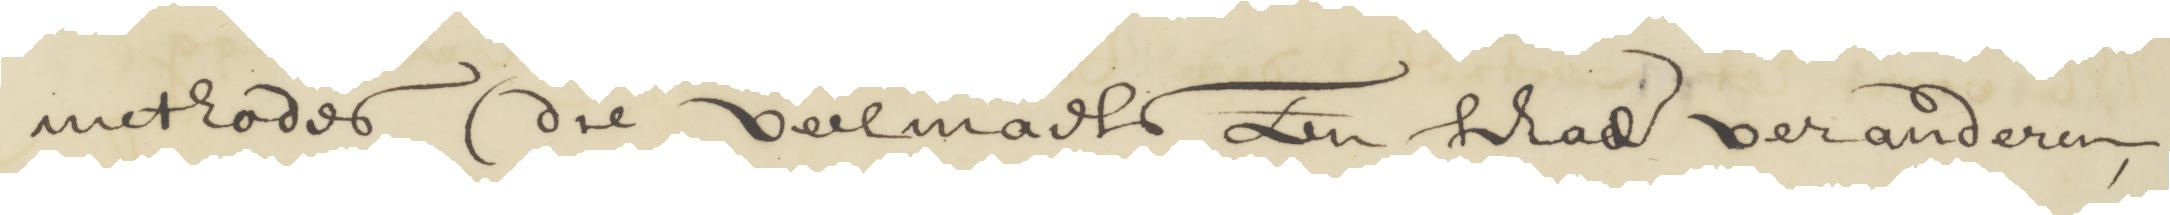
methodes (die veelmaels ten schade veranderen,
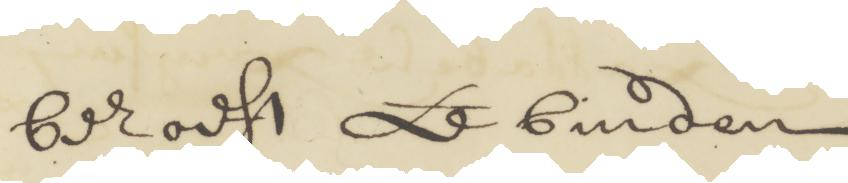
behoeft te binden
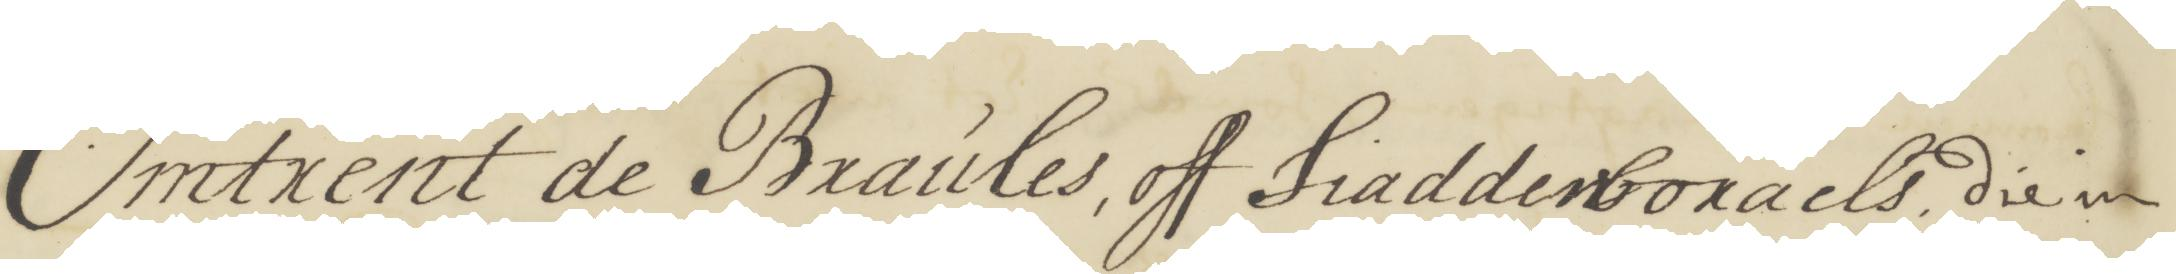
Omtrent de Braules, off Siadderboraels, die in
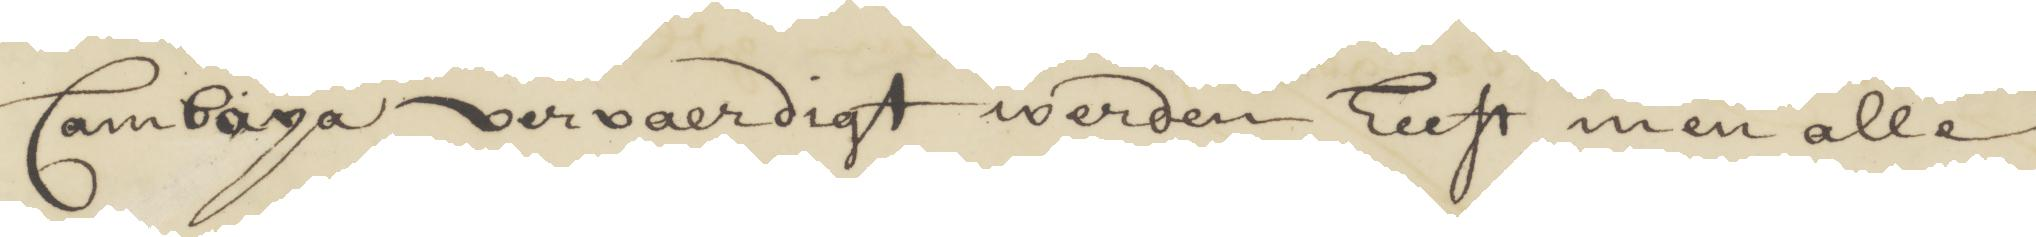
Cambaija vervaerdigt werden heeft men alle
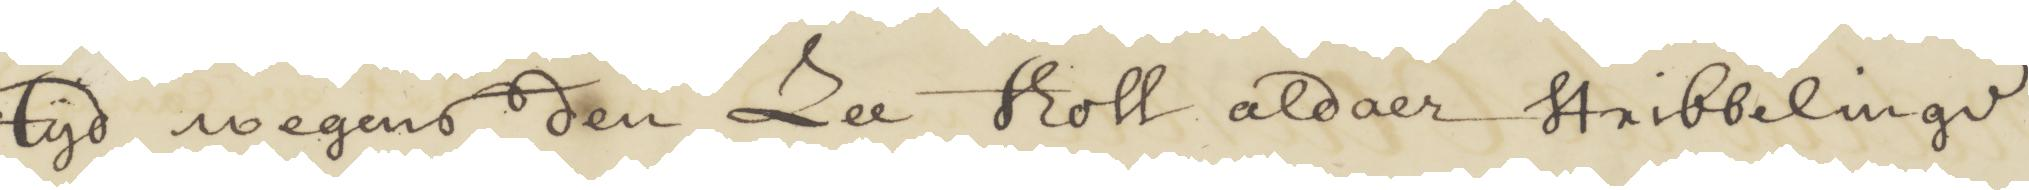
tijd wegens den zee tholl aldaer stribbelinge
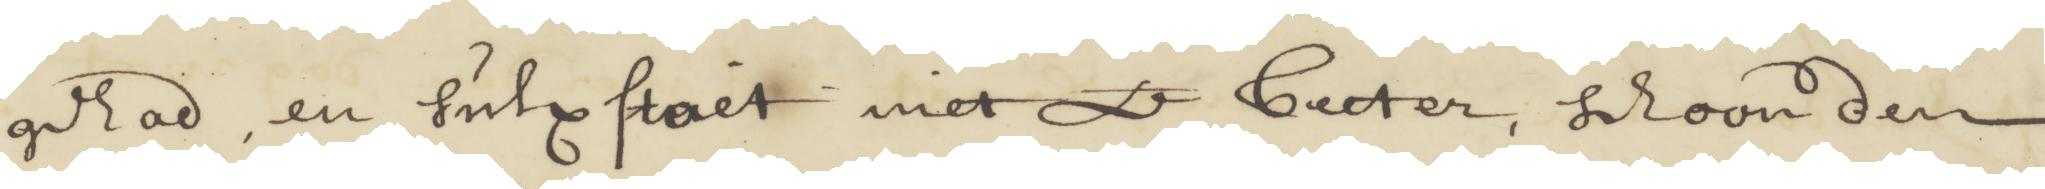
gehad, en sulx staet niet te beeter, schoon den
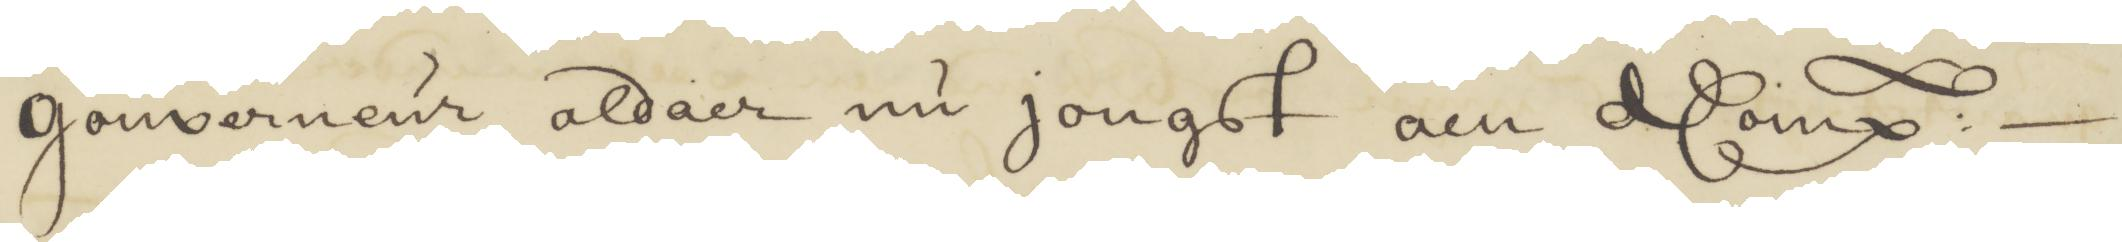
gouverneur aldaer nu jongst aen dComp: —
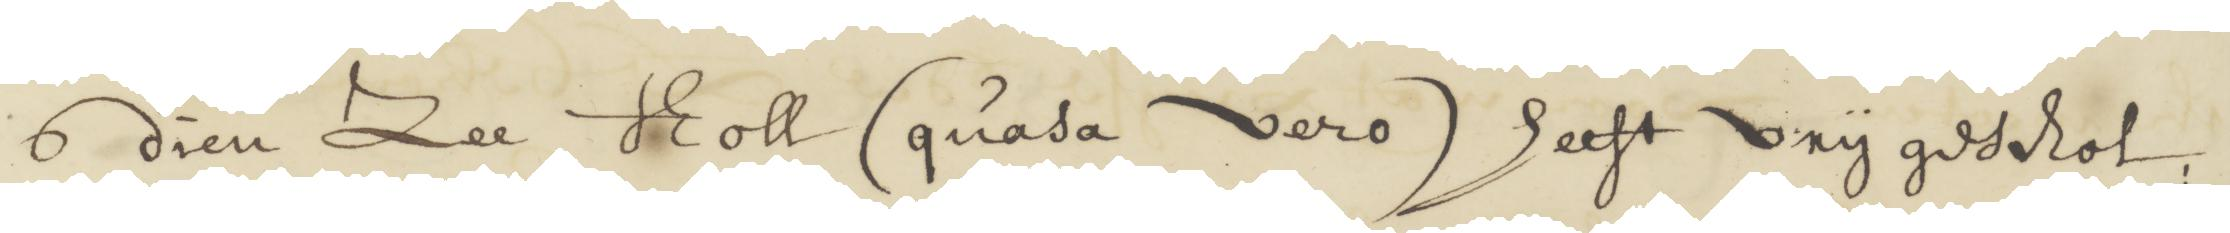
dien Zee tholl (quasa vero) heeft vrij geschol:
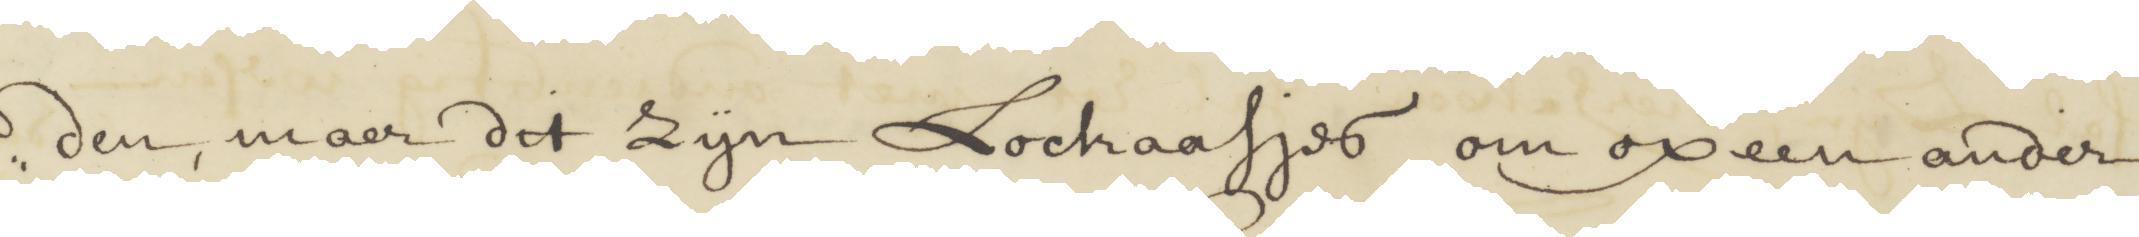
„den, maer dit zijn Lockaasjes om op een ander
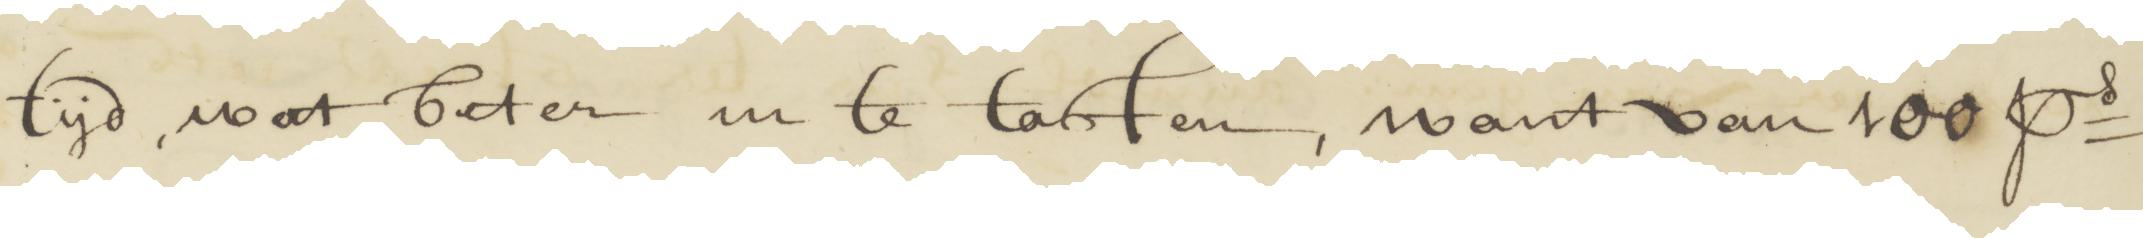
tijd, wat beter in te tasten, want van 100 p=s
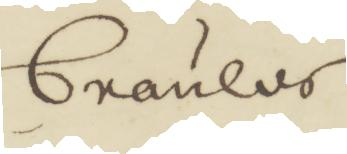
braules
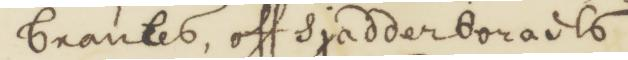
braules, off sjadderboraels
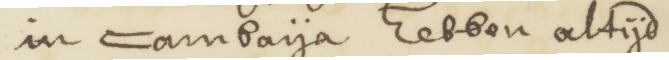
in cambaija hebben altijd
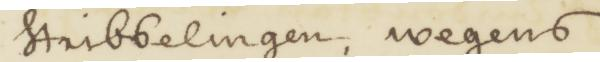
stribbelingen, wegens
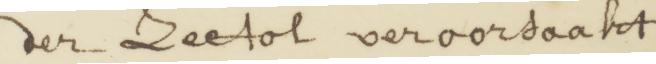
der zeetol veroorsaakt
